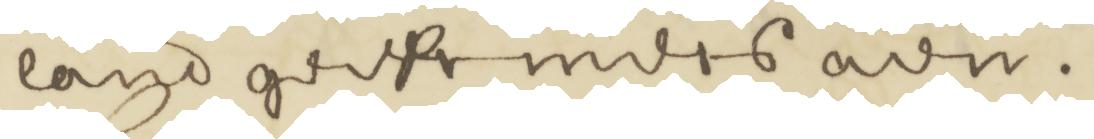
land geeft niets aen.
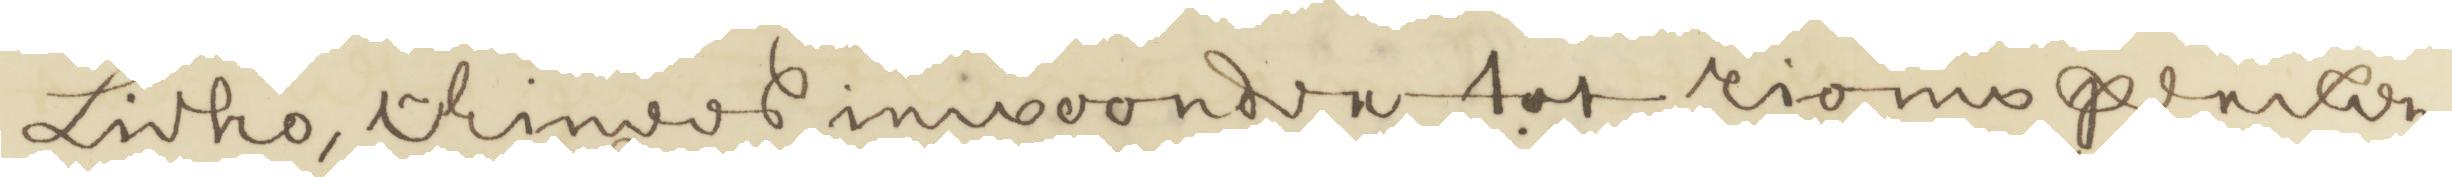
19. _:o Lieko, Chinees inwoonder tot riouw per Een
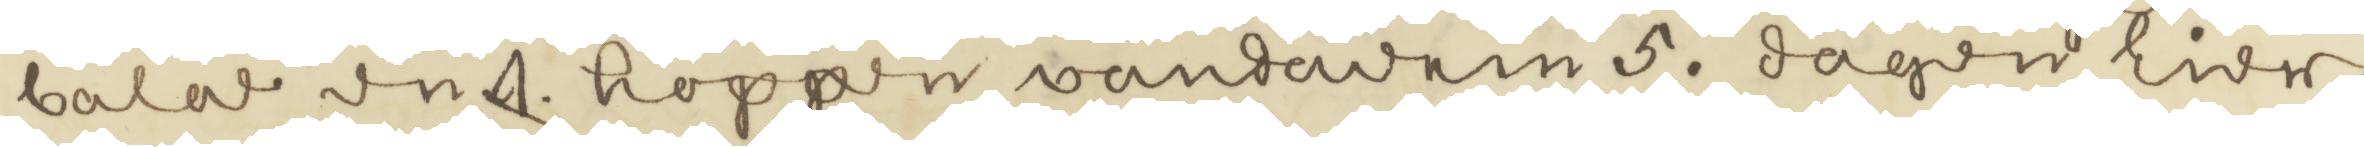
baloe en 4. koppen vandaer in 5. dagen hier
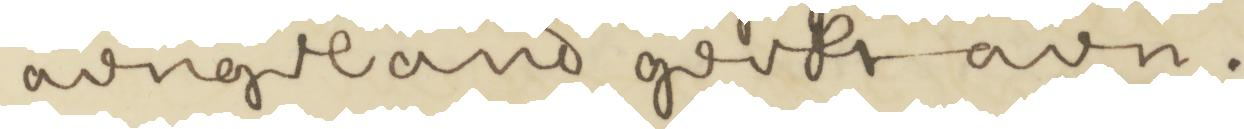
aengeland geeft aen.
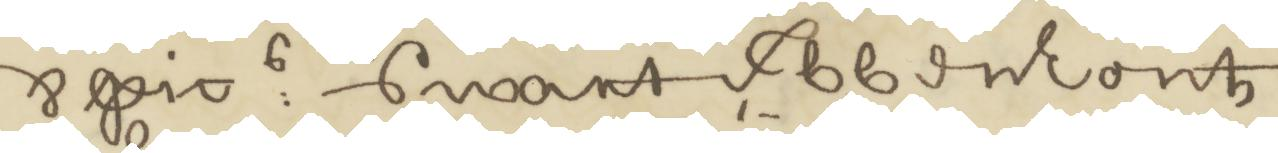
8 pic:s swart Ebbenhout
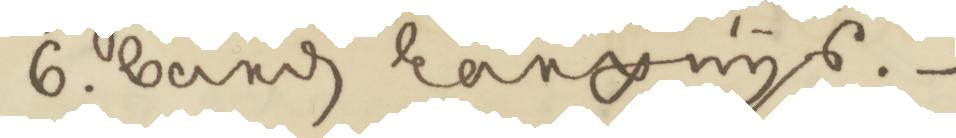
6. baren harpuijs.
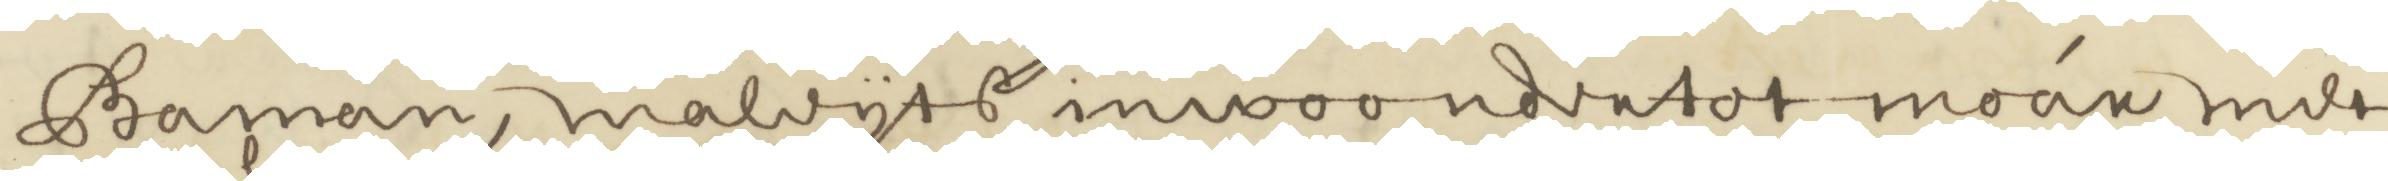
Baman, maleijts inwoonder tot moár met
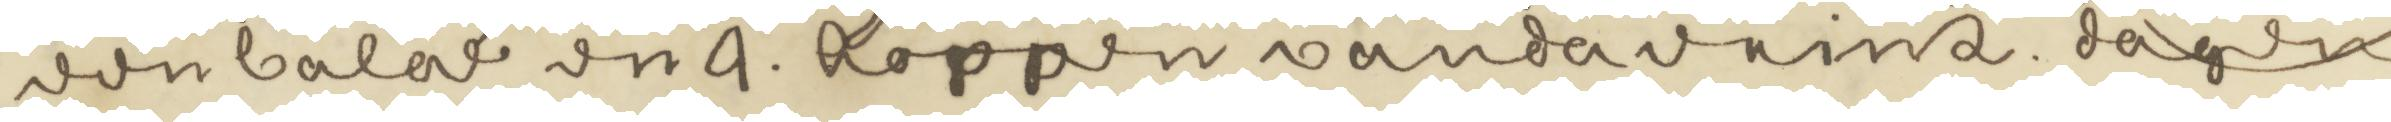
een baloe en 4. koppen vandaer in 2. dagen
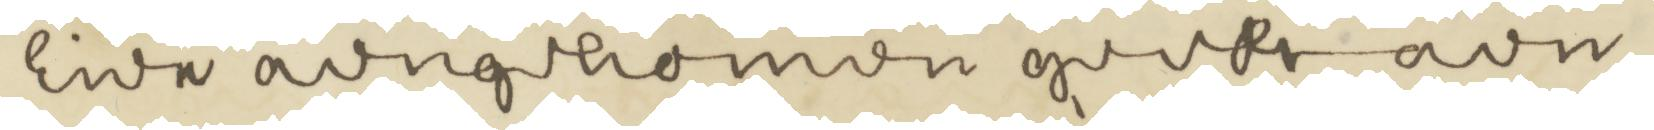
hier aengekomen geeft aen
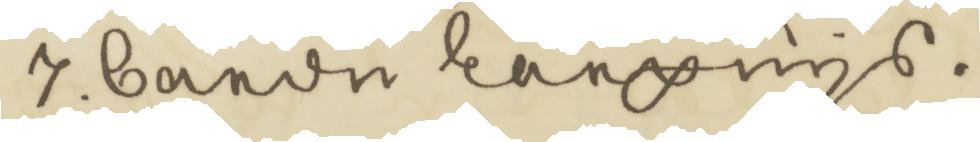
7. baren harpuijs.
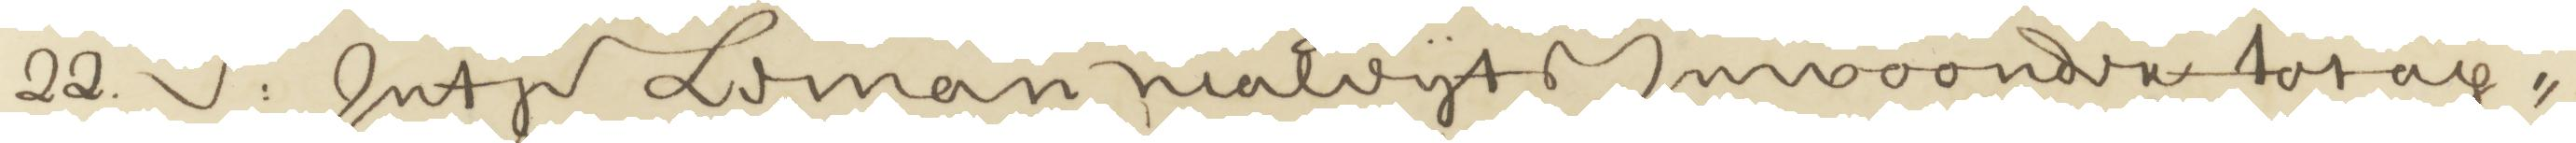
22. _:o jntje Leman maleijts jnwoonder tot ap„
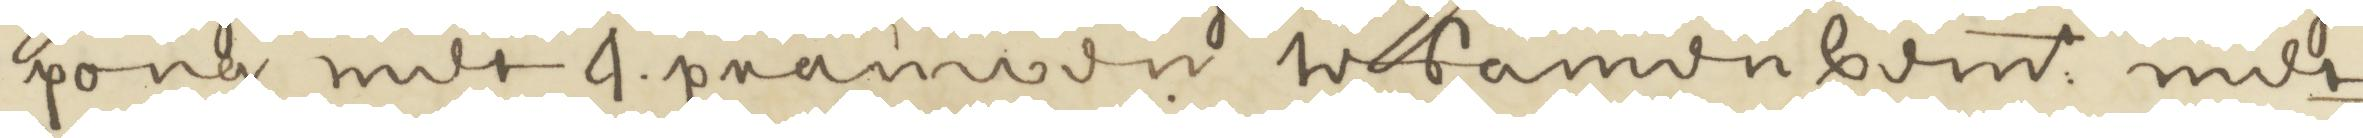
pong met 4. prauwen te samen bem:t met
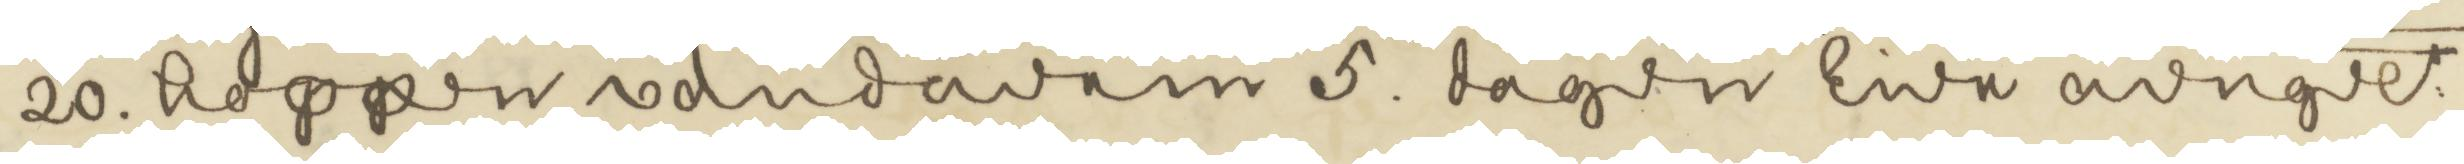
20. koppen vandaer in 5. dagen hier aengel:t
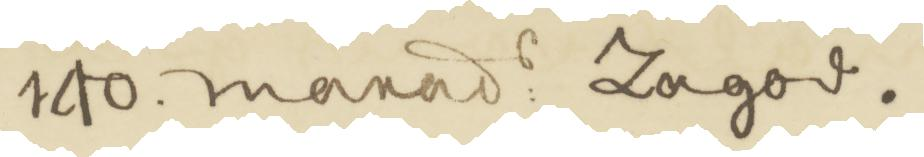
140. marad:s zagoe.
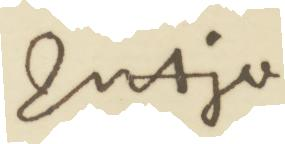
jntje
